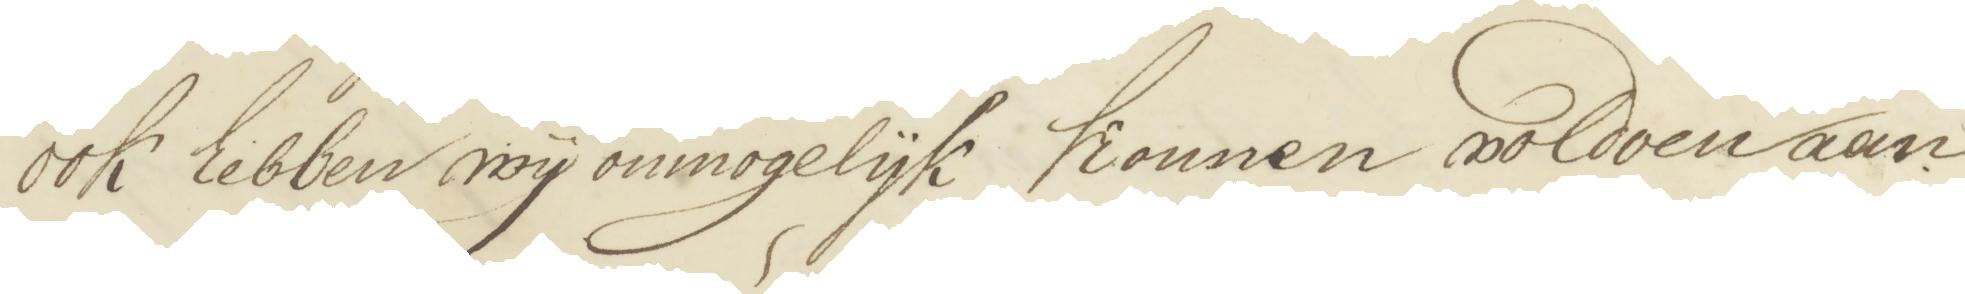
ook hebben wij onmogelijk konnen voldoen aan
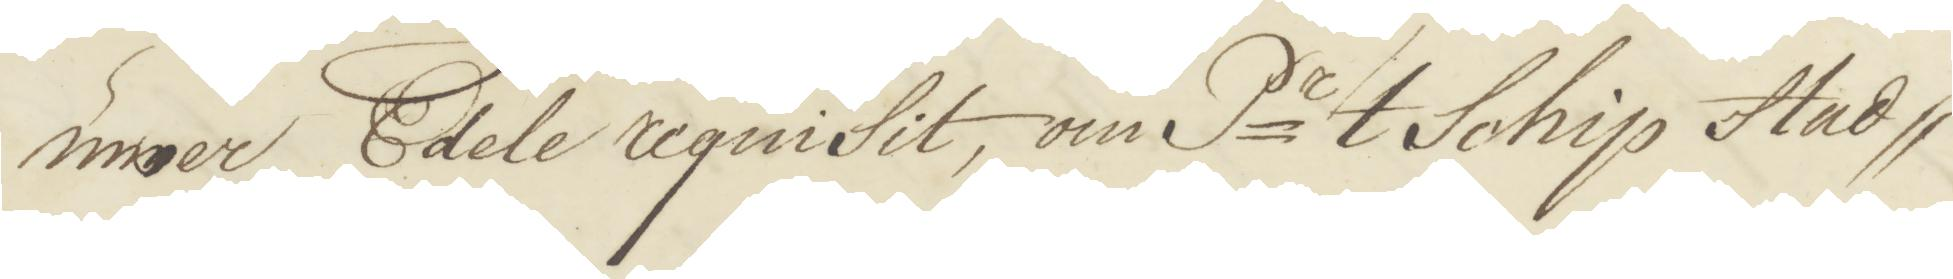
uwer Edele requisit, om P=r ’t schip Stad„
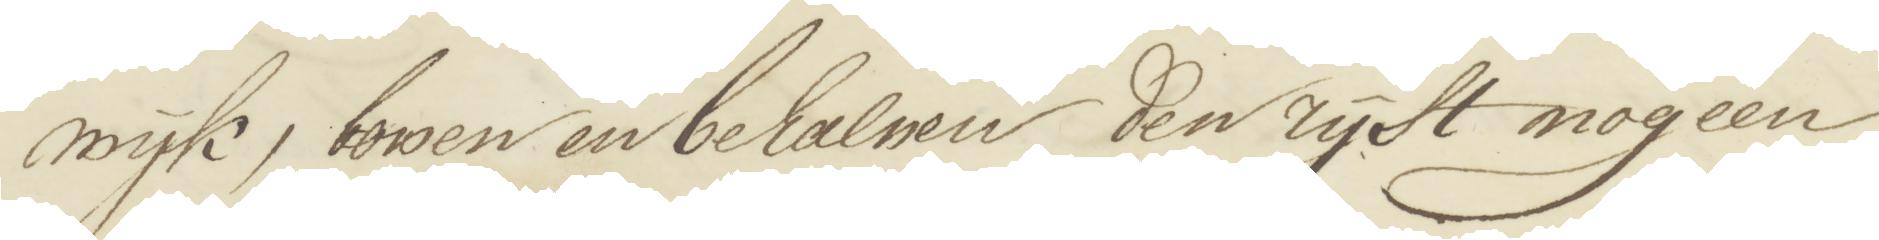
wijk, boven en behalven den rijst nog een
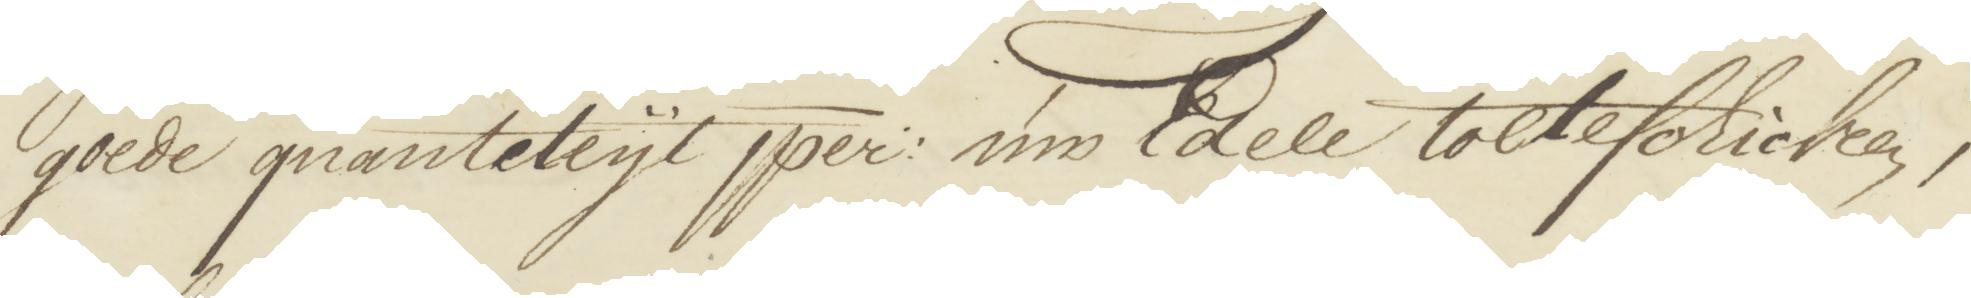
goede quantiteijt pper: uw Edele toeteschicken,
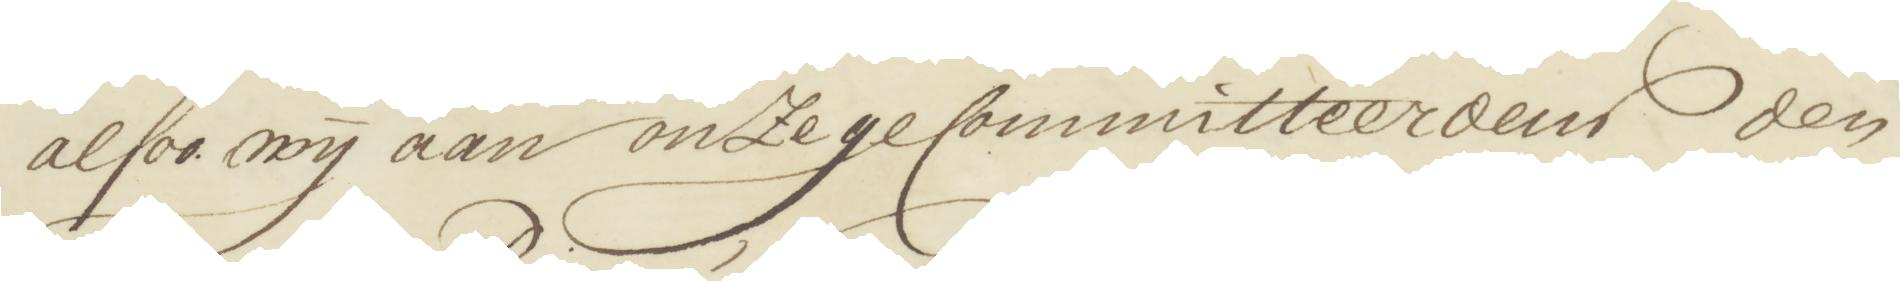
alsoo wij aan onze gecommitteerdens den
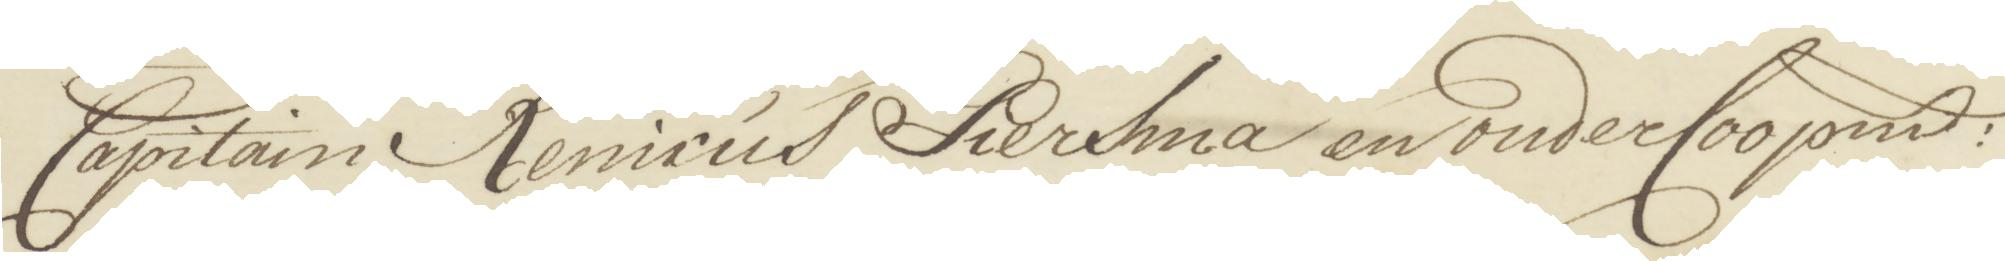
Capitain Renicus Siersma en ondercoopm:
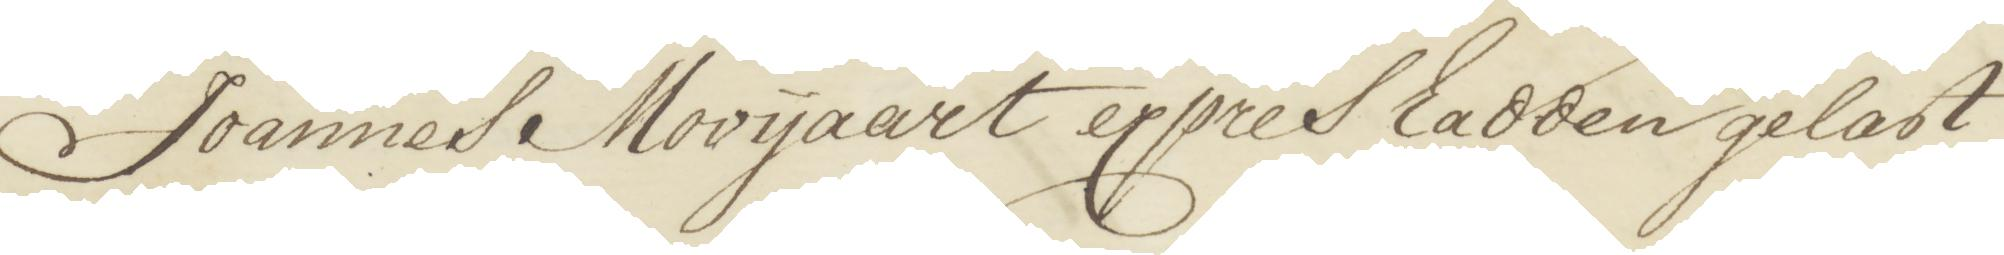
Joannes Mooijaart expres hadden gelast
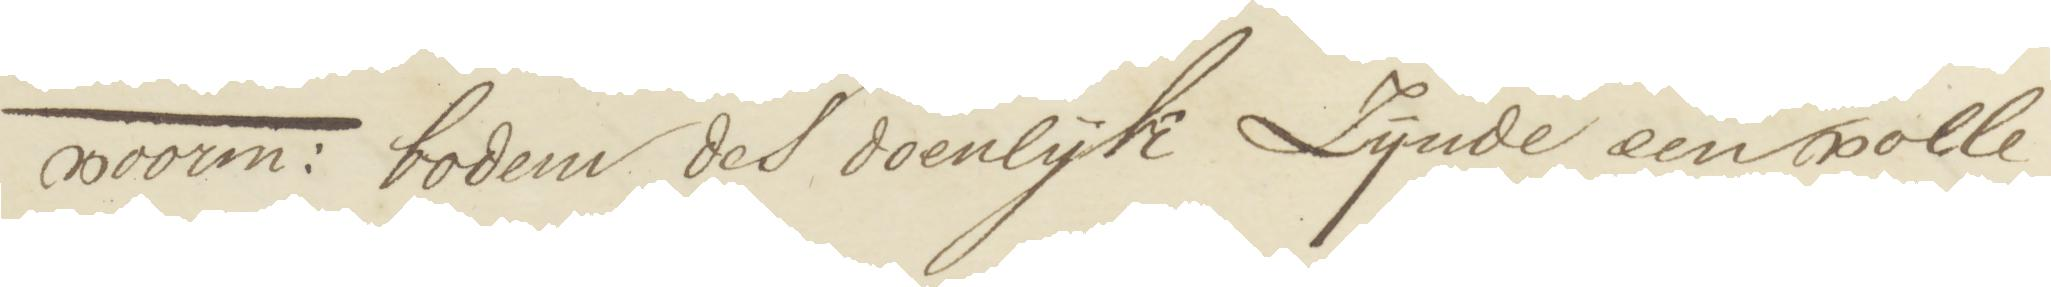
voorm: bodem des doenlijk zijnde een volle
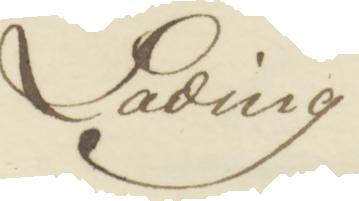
Lading
